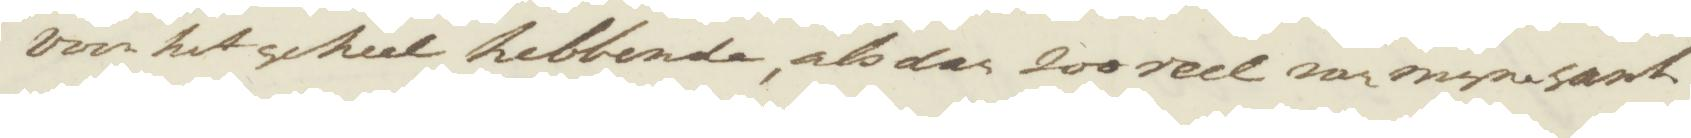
voor het geheel hebbende, als dan zoo veel van myne gant
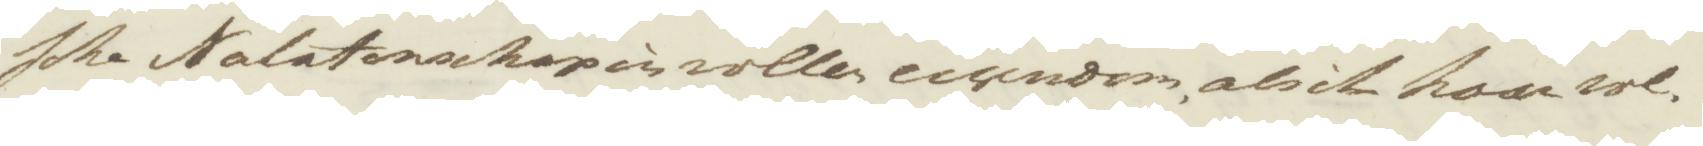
sche Nalatenschap in vollen eigendom, als ik haar vol„
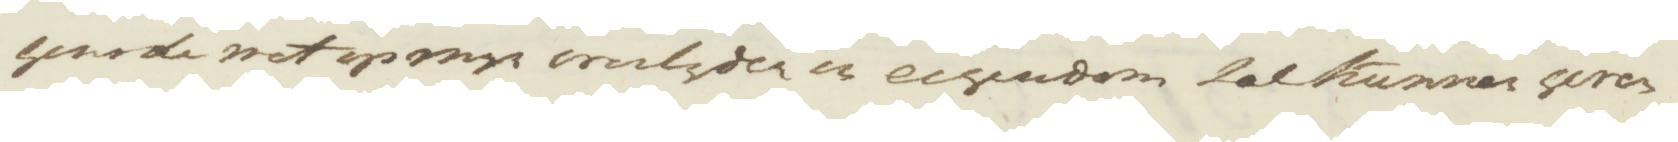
gens de wet op myn overlyden in eigendom zal kunnen geven
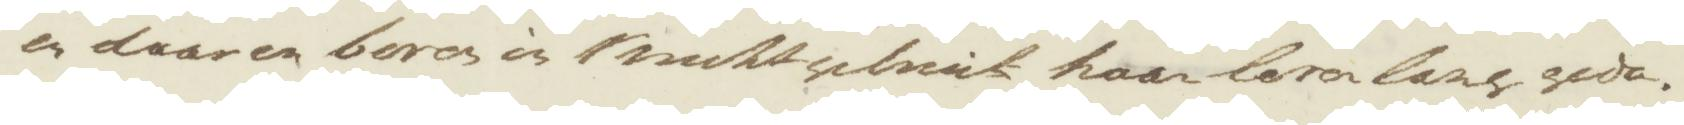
en daar en boven in vruchtgebruik haar levenlang gedu„
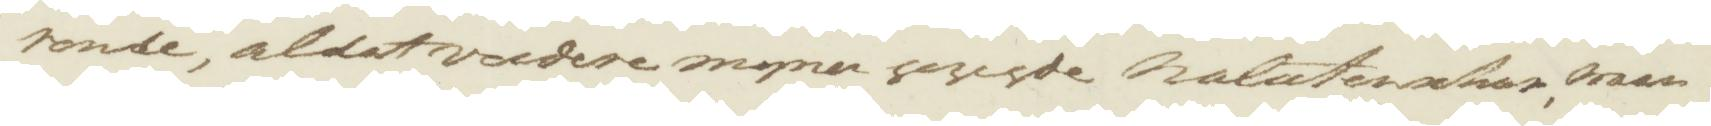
rende, aldat verdere myner gezegde nalatenschap waar
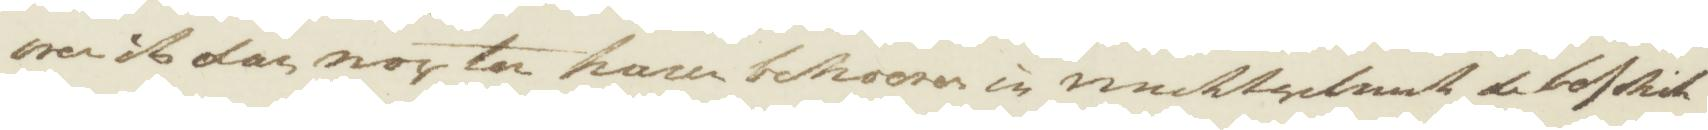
over ik dan nog ten haren behoeven in vruchtgebruik de beschik
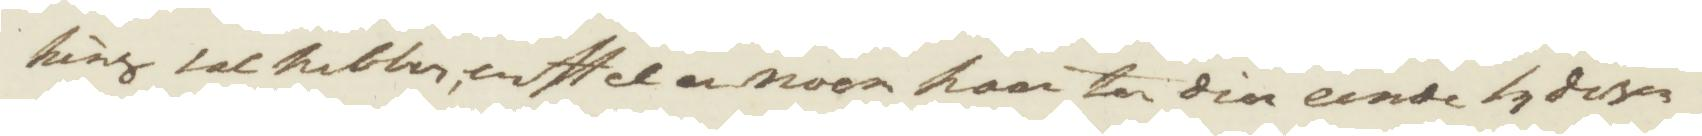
king zal hebben, en stel en noem haar ten dien einde by dezen
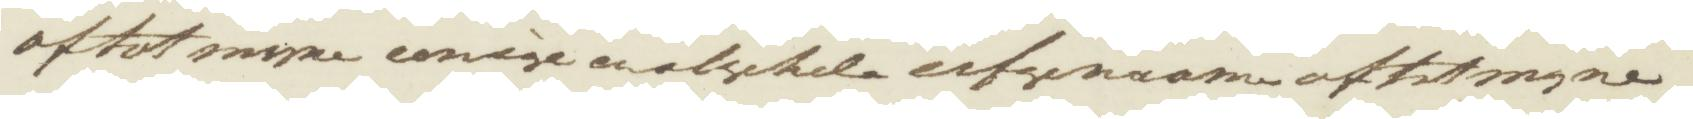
of tot myne eenige en algehele erfgenaame of tot myne
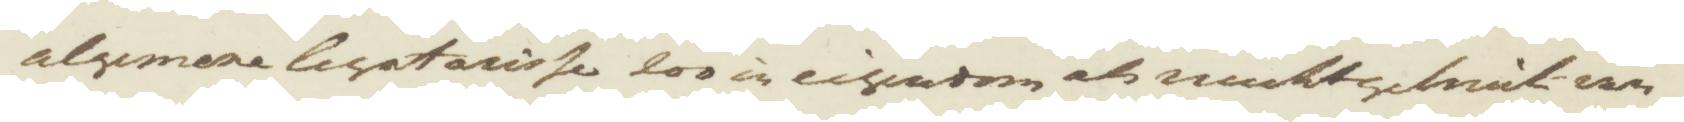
algemene legatarisse zoo in eigendom als vruchtgebruik van
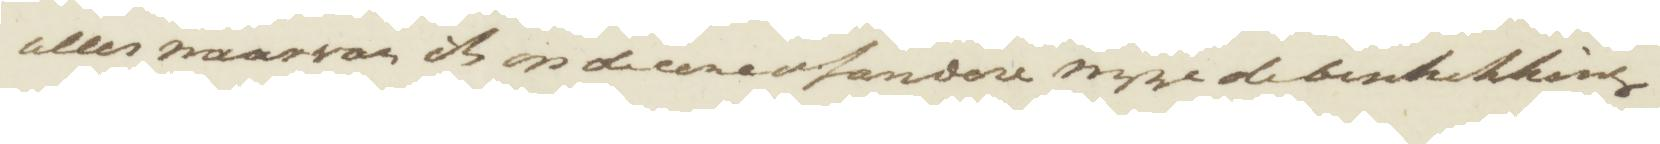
alles waarvan ik op de eene of andere wyze de beschikking
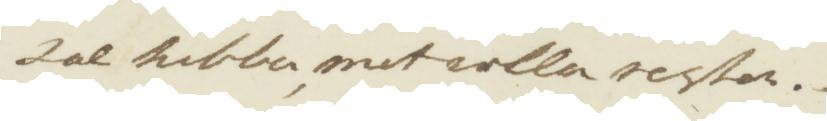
zal hebben met vollen regten.
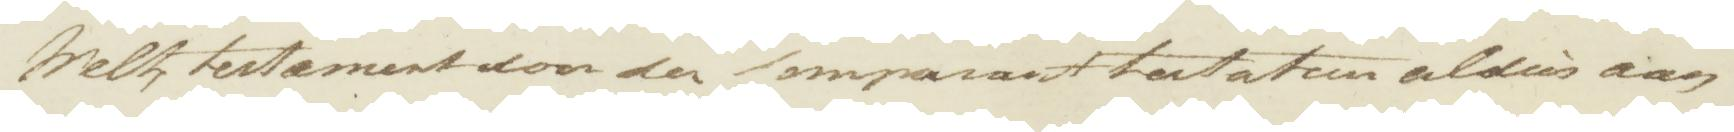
Welk testament door den Comparant testateur aldus aan
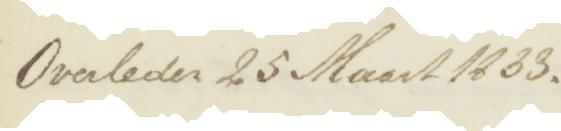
Overleden 25 Maart 1833.
